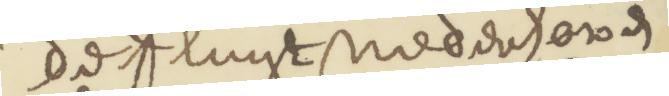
de fluijt nederhoven
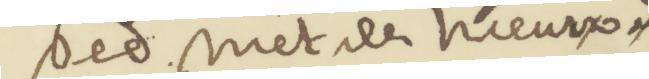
sed:t met een nieuwe
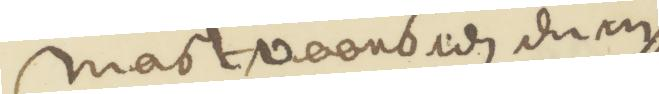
mast voorsien en in
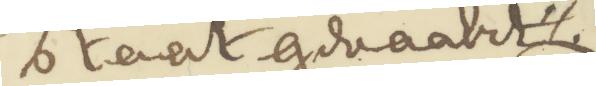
staat geraakt.
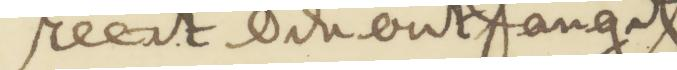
recit der ontfangen
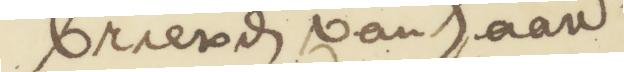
brieven van haar
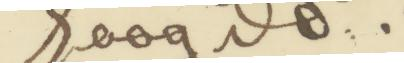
hoog Ed:s
